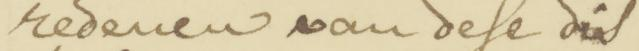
redenen van dese dis
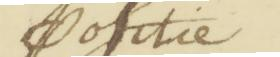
positie
